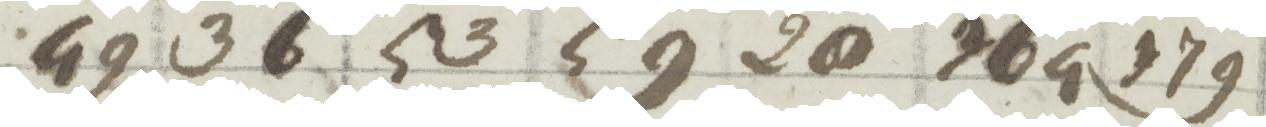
49 36 53 59 28 364 179
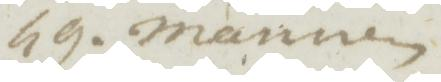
49. mannen
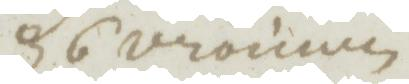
36 vrouwen
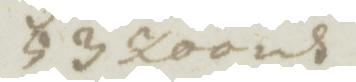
53 zoons
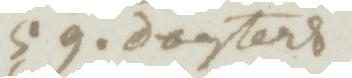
59. dogters
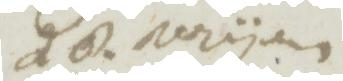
28. vrijen
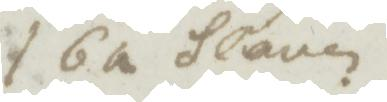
164 slaven
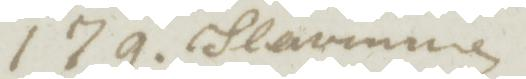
179. slavinnen
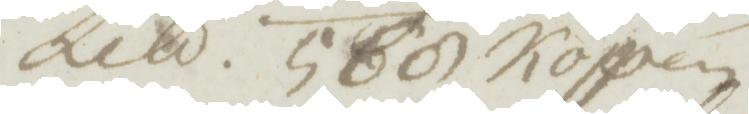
Teld. 568 Koppen
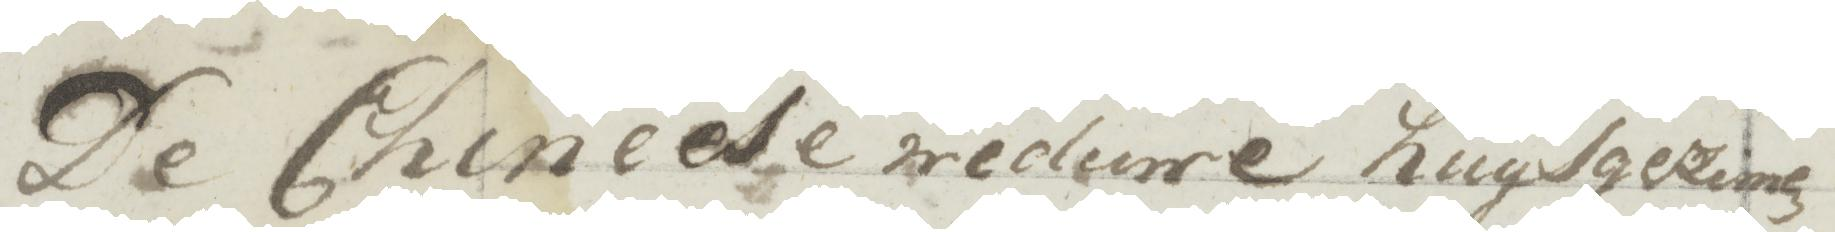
De Chineese weduwe huijsgezinnen
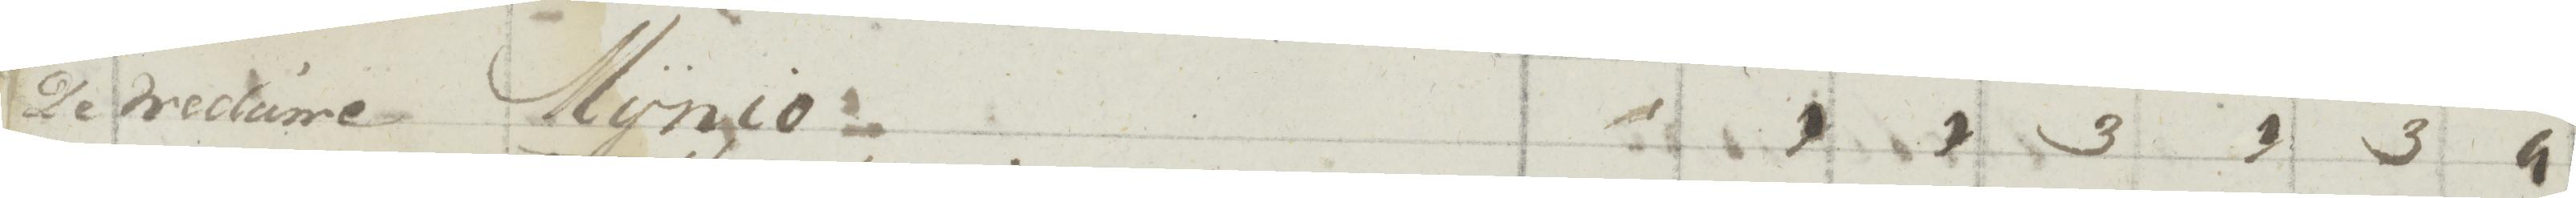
De weduwe Mijnio 1 1 3 1 3 4
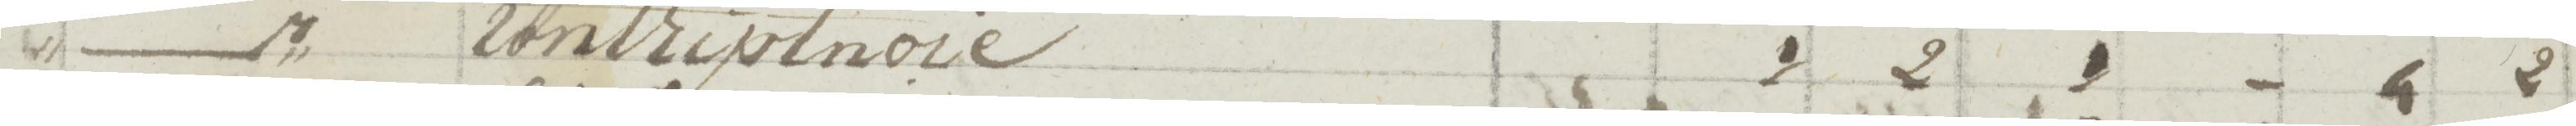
„ _„o Tonthiptnoie 1 2 1 – 4 2
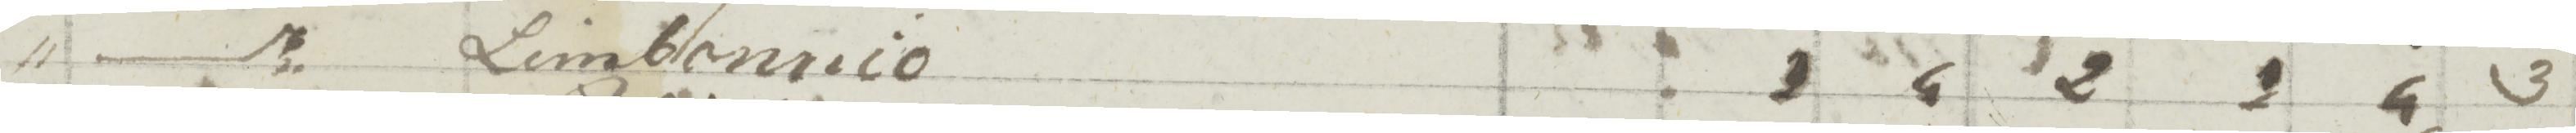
„ _„o Limbonnio 1 4 2 1 4 3
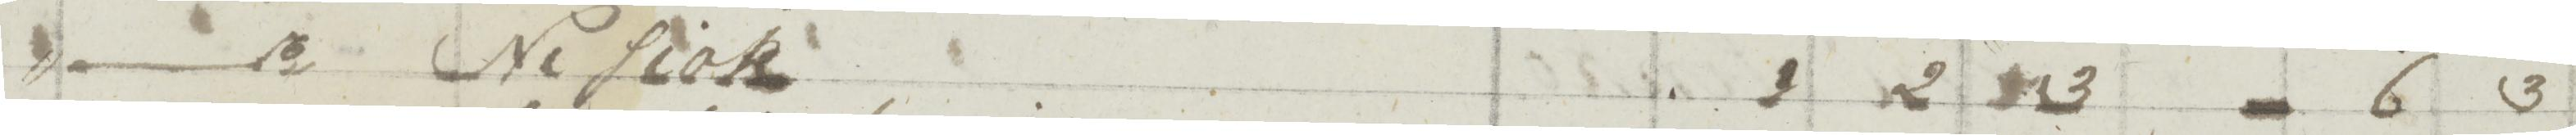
„ _„o 1 Nisiok 1 2 3 – 6 3
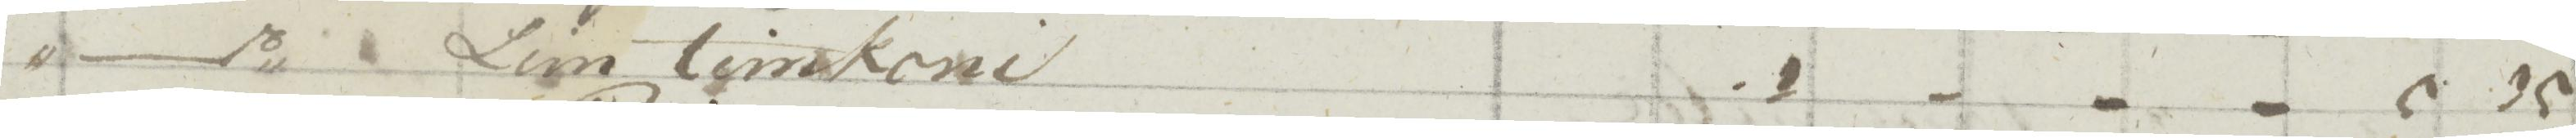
„ _„o 1 Lim timkoni 1 – – – 5 15
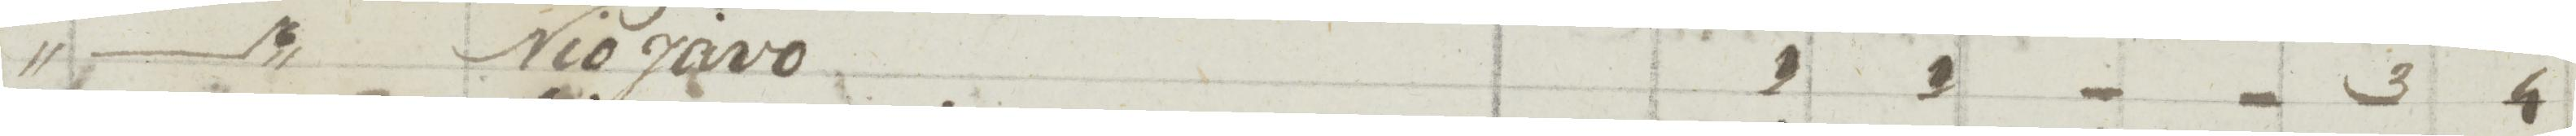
„ _„o „ Niojavo 1 1 – – 3 4
